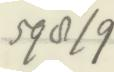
598/9
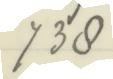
738
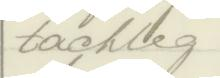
tachteg
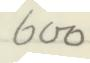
600
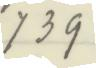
739
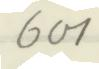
601
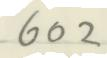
602
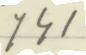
741
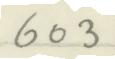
603
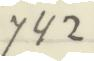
742
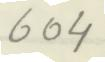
604
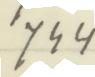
744
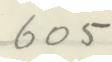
605
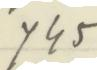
745
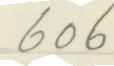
606
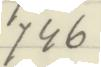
746
